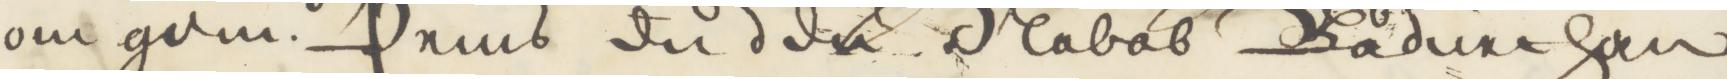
om gem.e Prins en den Nabab Badunchan
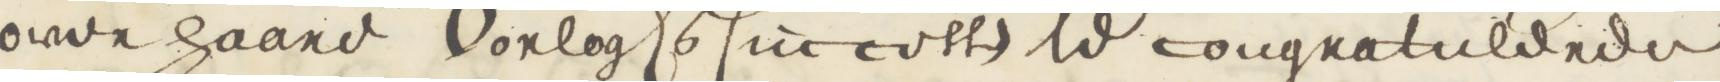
over haare Oorloghssuccessen te congratuleren
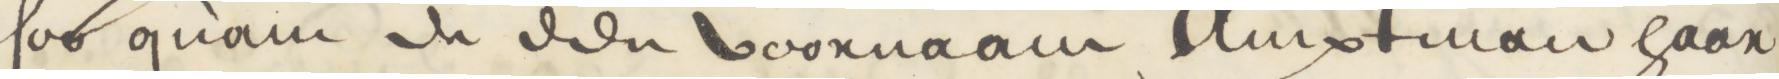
soo quam ik een voornaam Amptman haar
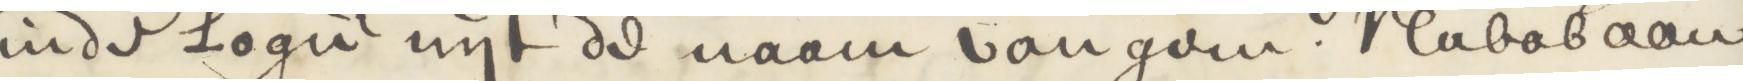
in de Logie uijt de naam van e.Nabab aan
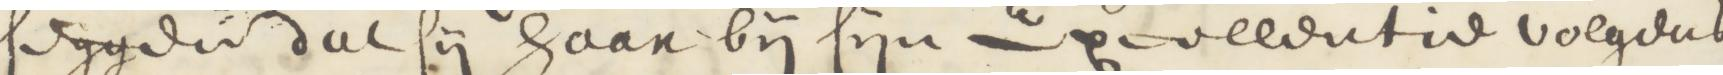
seggen dat sij haar bij sijn Excellentie volgens
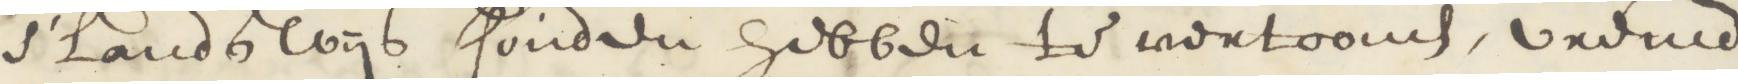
s'Lands wijs souden hebben te vertoonen, vremd
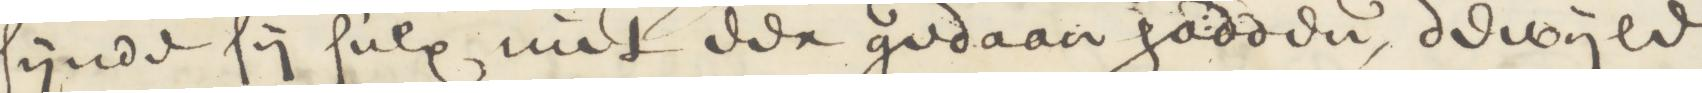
sijnde sij sulx niet eer gedaan hadden, de wijle
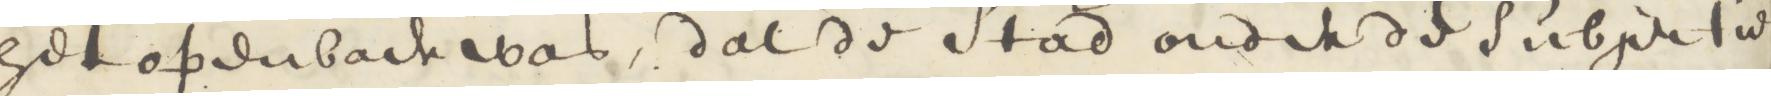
het openbaer was, dat de stad onder de subjectie
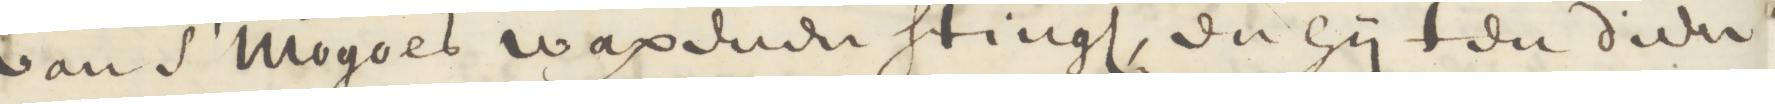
van s'Mogols wapenen stingh, en hij ten dien
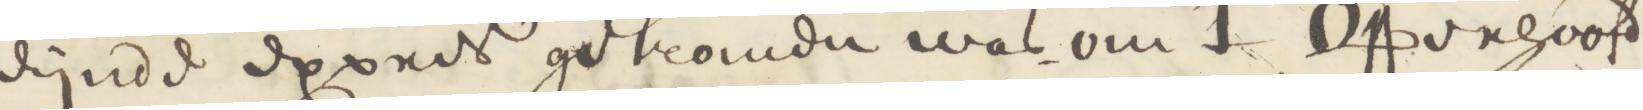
einde express gekomen was om 't Opperhoofd
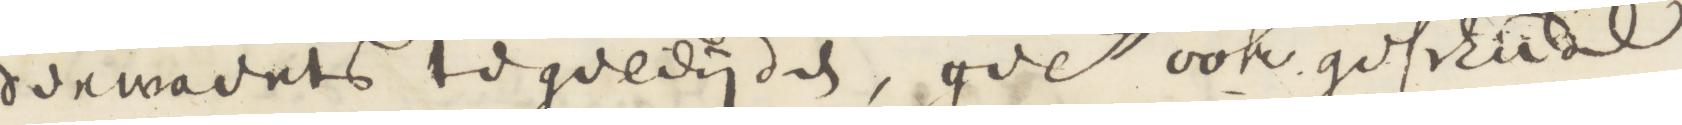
derwaerts te geleijden, gelt ook geschiede,
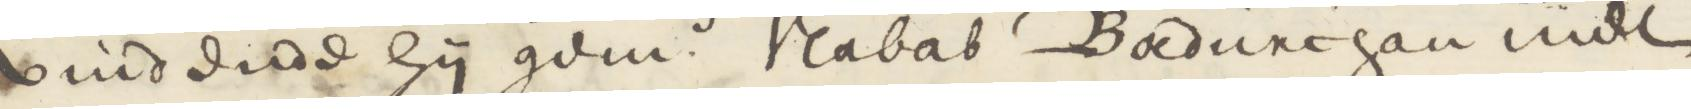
vindende hij gem:s Nabab Badunchan inde
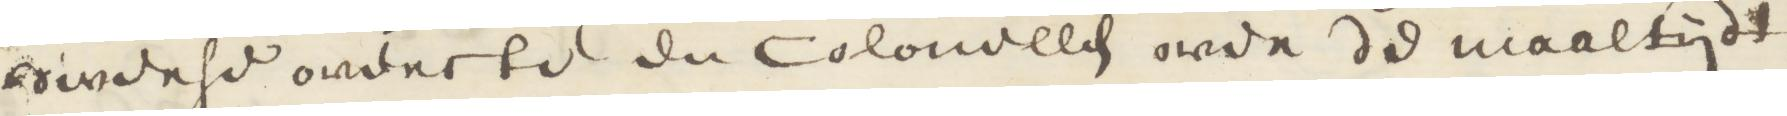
diverse overste en colonellen over de maaltijdt
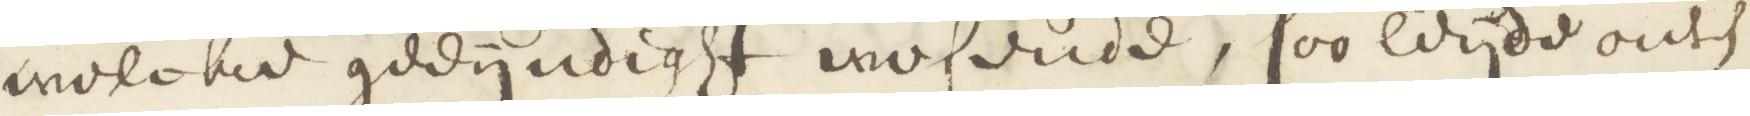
welcke geeijndight wesende, soo leijde onsen
